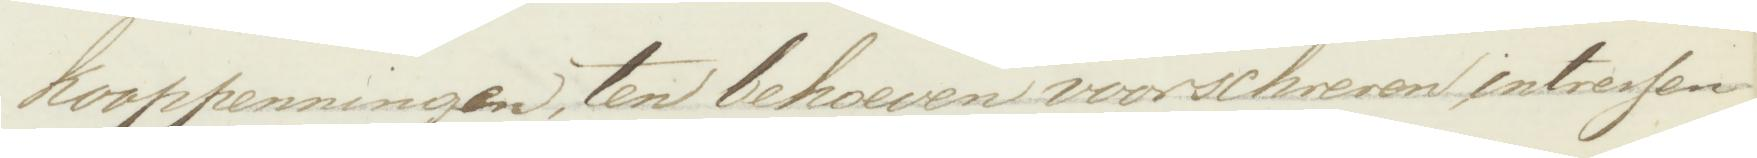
kooppenningen, ten behoeven voorschreven intressen
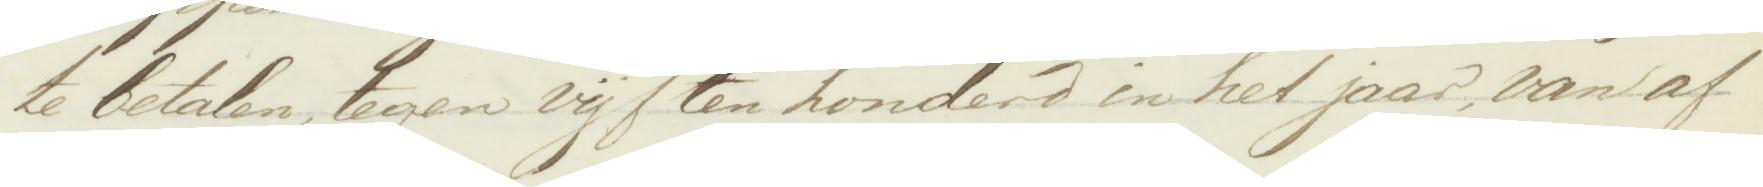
te betalen, tegen vijf ten honderd in het jaar, van af
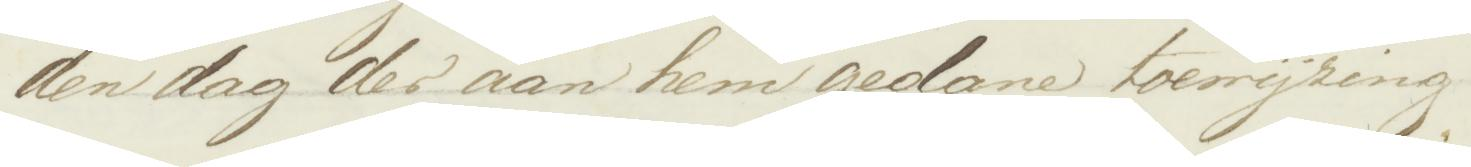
den dag der aan hem gedane toewijzing
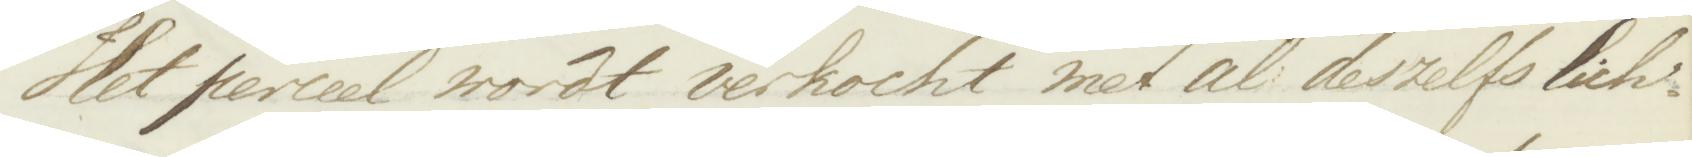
Het perceel wordt verkocht met al deszelfs lich„
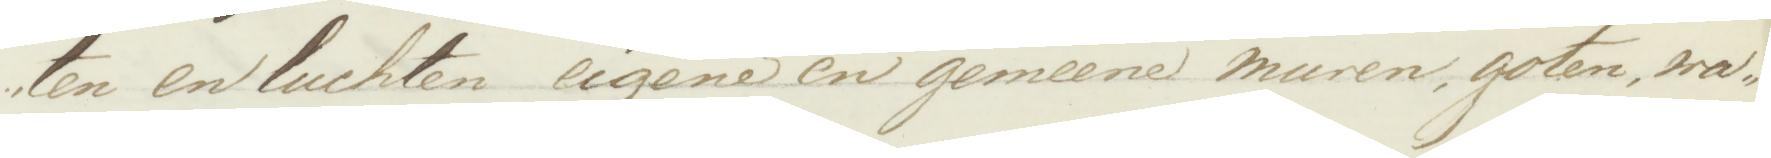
„ten en luchten eigene en gemeene muren, goten, wa„
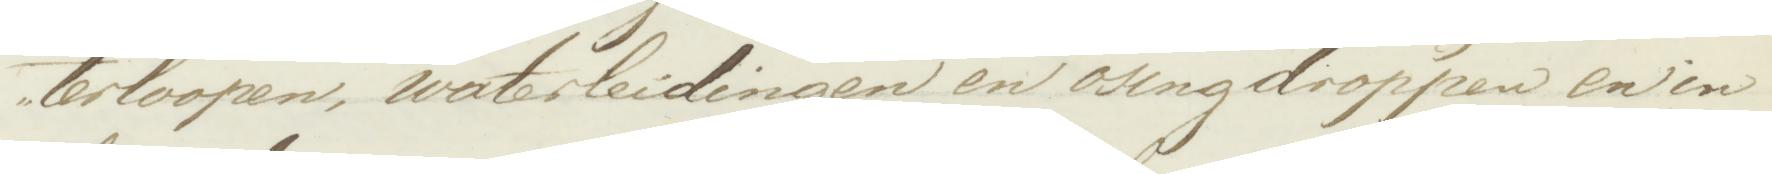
„terloopen, waterleidingen en osing droppen en in
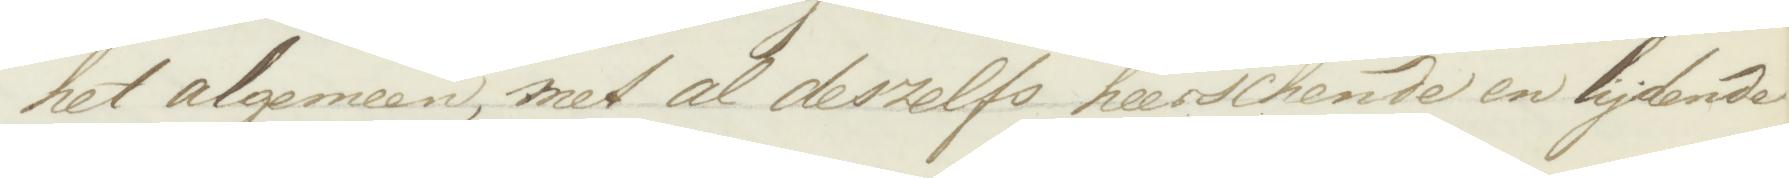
het algemeen, met al deszelfs heerschende en lijdende
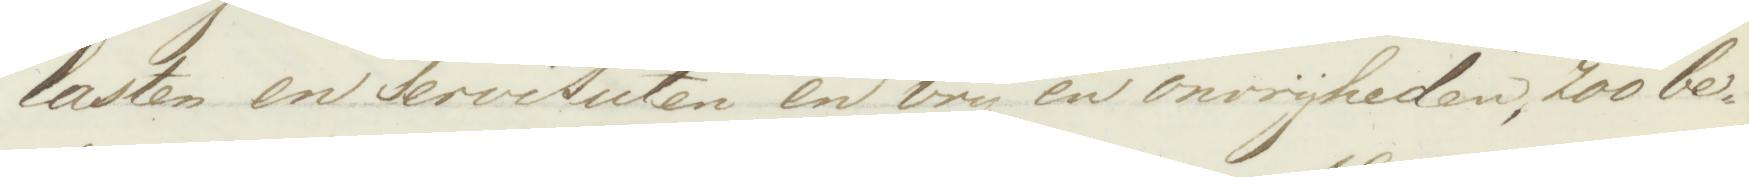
lasten en servituten en vrij en onvrijheden, zoo be„
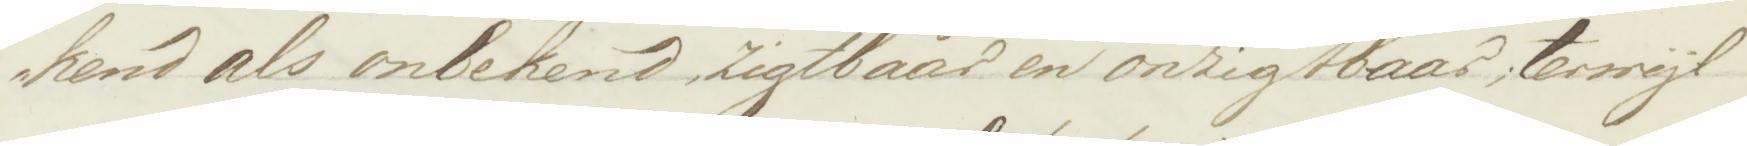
„kend als onbekend, zigtbaar en onzigtbaar; terwijl
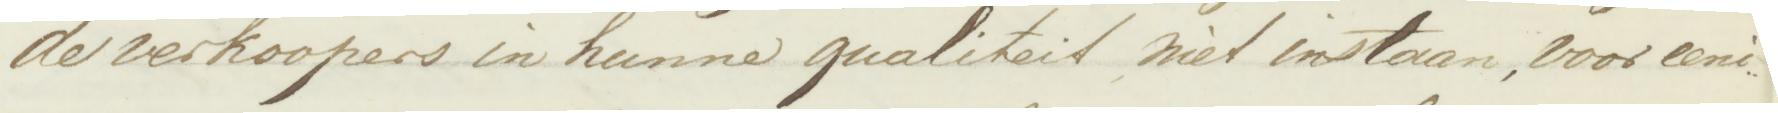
de verkoopers in hunne qualiteit niet instaan, voor eeni„
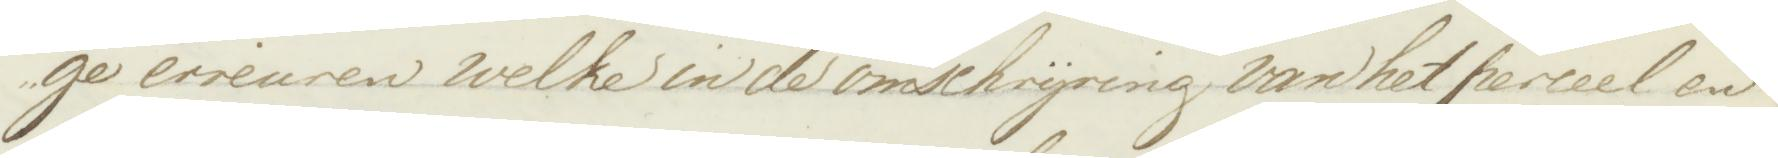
„ge erreuren welke in de omschrijving van het perceel en
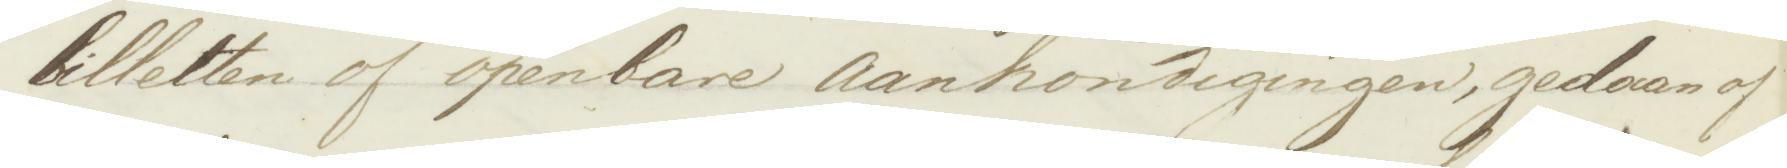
billetten of openbare aanhondigingen, gedaan of
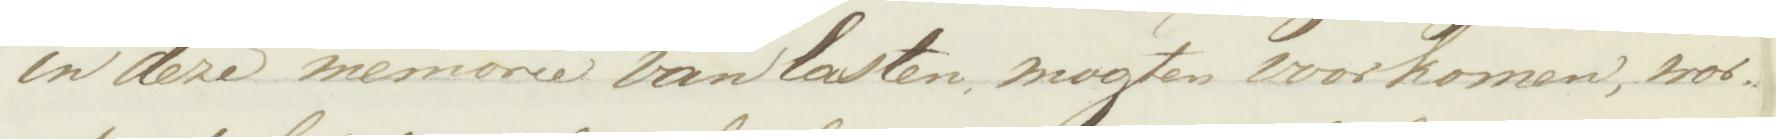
in deze memorie van lasten, mogten voorkomen, wor„
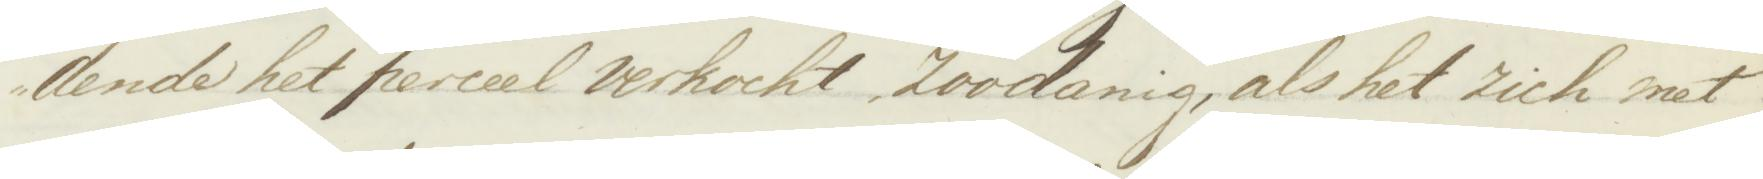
„dende het perceel verkocht, zoodanig, als het zich met
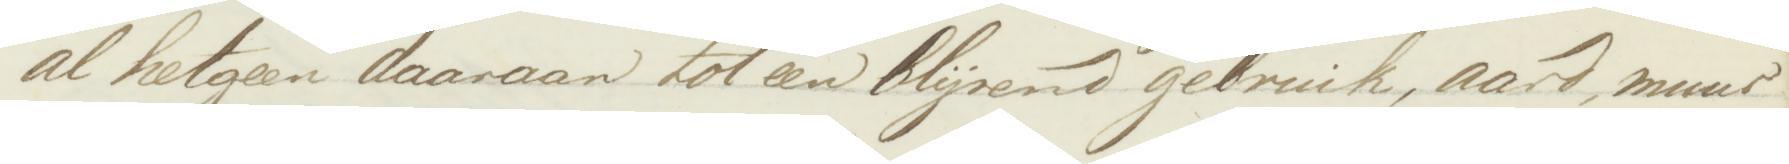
al hetgeen daaraan tot een blijvend gebruik, aard, muur
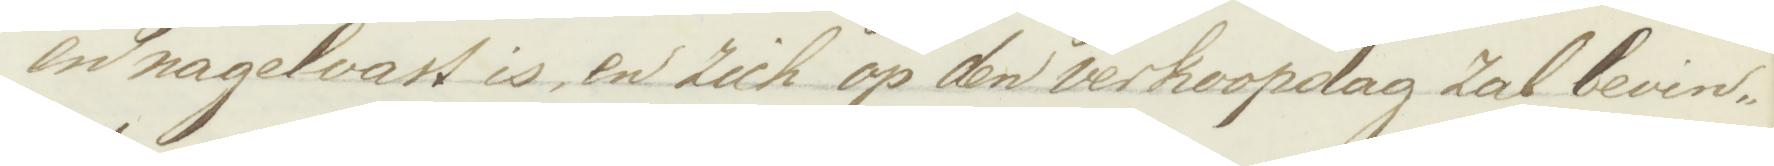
en nagelvast is, en zich op den verkoopdag zal bevin„
